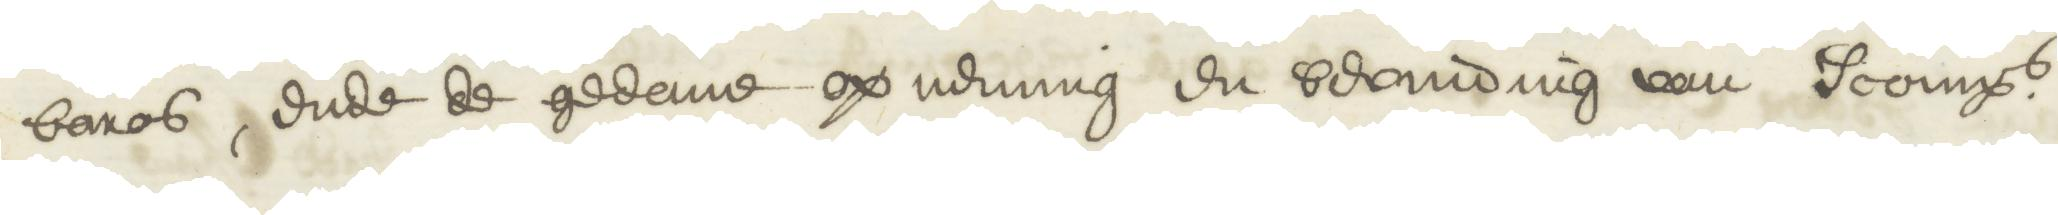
baros, ende de gedane opneming en bevinding van 'Scomp:s
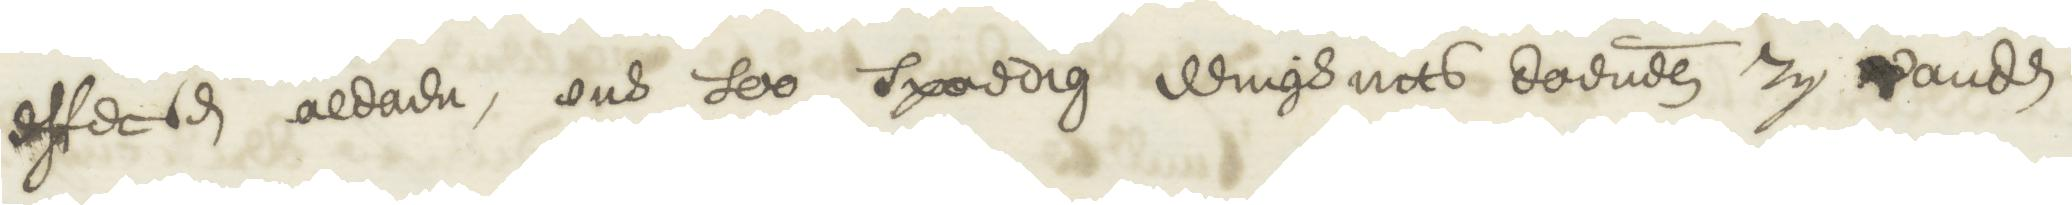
effecten aldaer, ons soo spoedig eenigsints doenelijk zy vanden
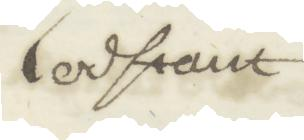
toestant
